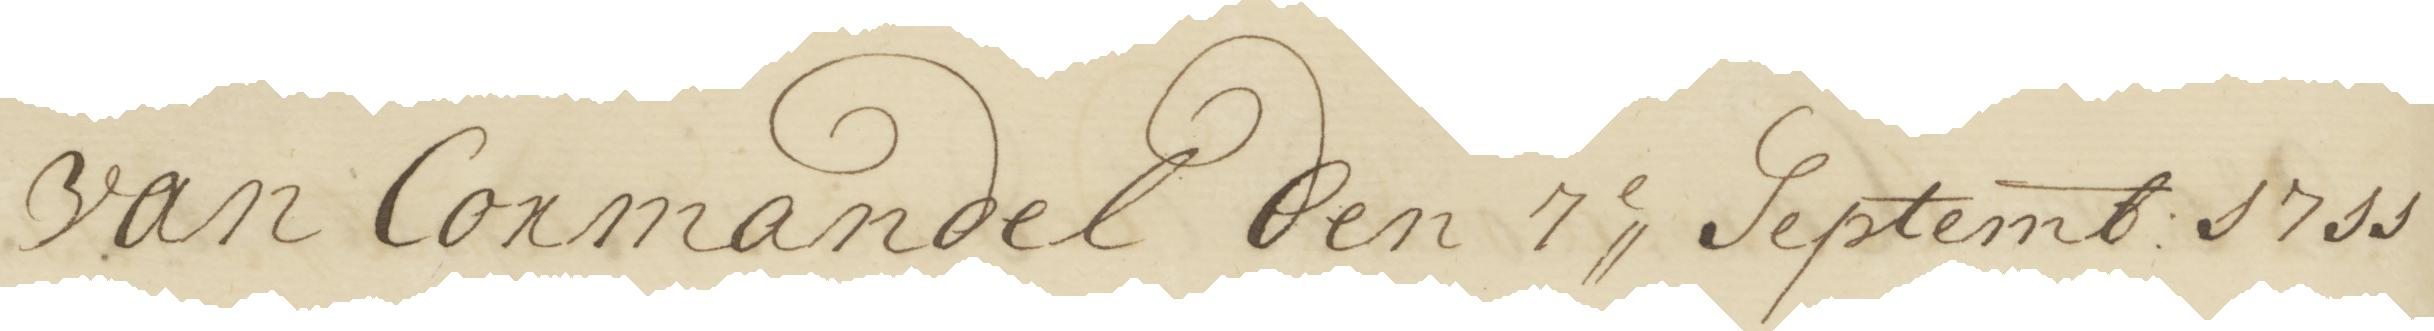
van Cormandel den 7„e Septemb: 1711
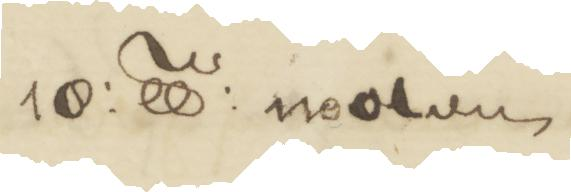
18: lb: nooten
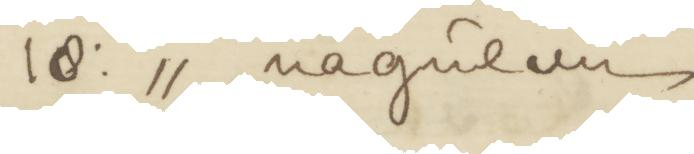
18: „ nagulen
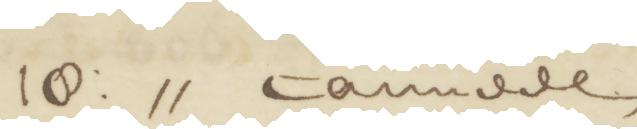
10: „ canneel
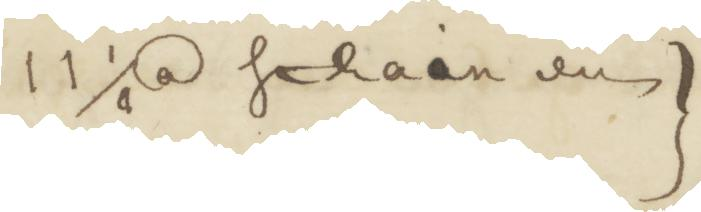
11½ @ schair en }
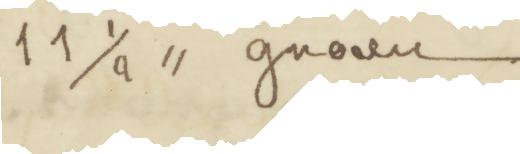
11¼ „ groen
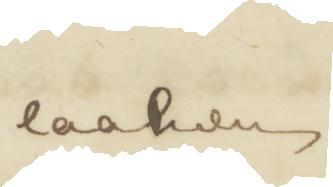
laaken
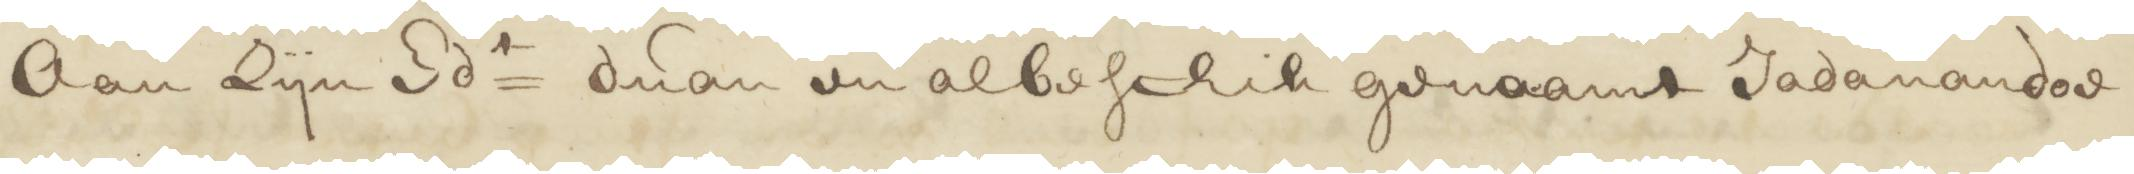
Aan zijn Ed=t duan en albeschik genaamt Iadanandoe
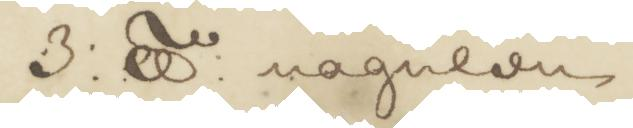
3: lb: nagulen
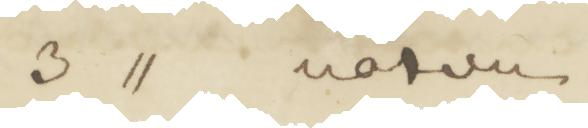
3 „ noten
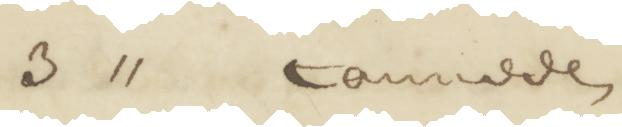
3 „ canneel
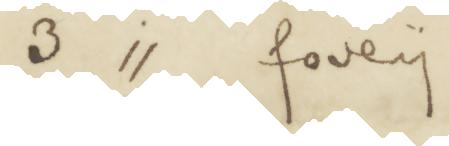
3 „ foelij
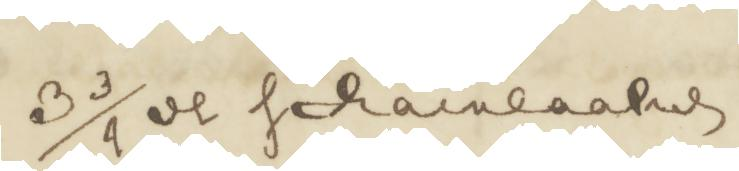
3¾ el schairlaaken
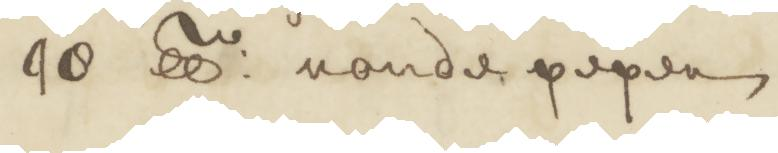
48 lb: ronde peper
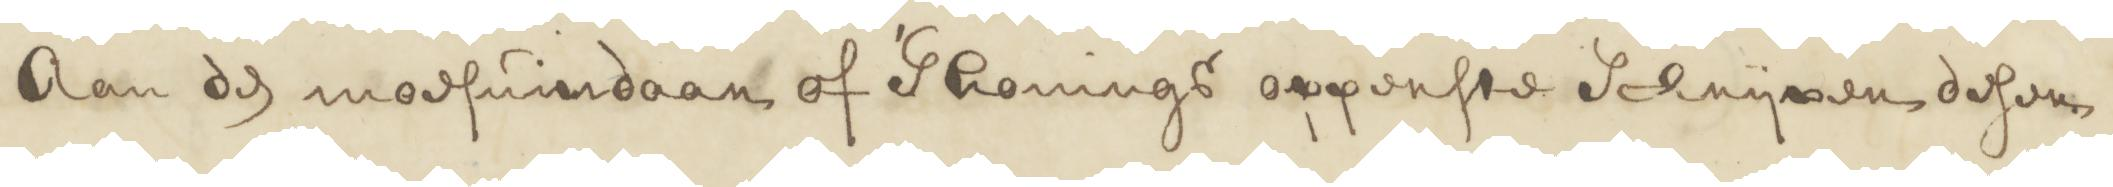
Aan den moesuindaar of 'S konings opperste schrijver deser
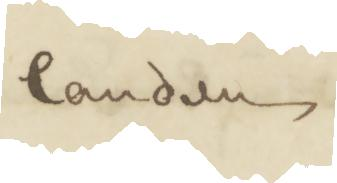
landen
